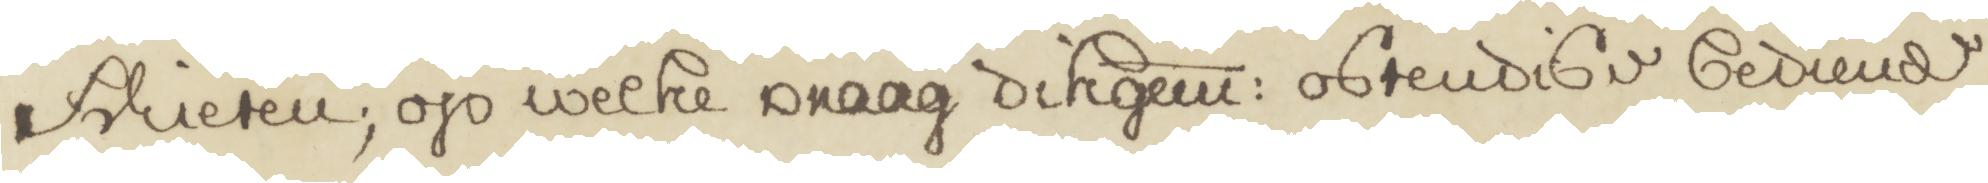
schieten; op welke vraag dikgem: ostendise bediende
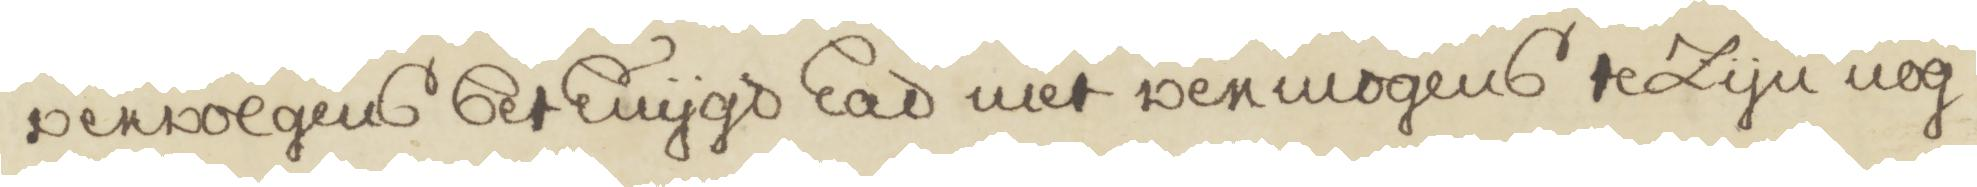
vervolgens bethuijgd had niet vermogens te zijn nog
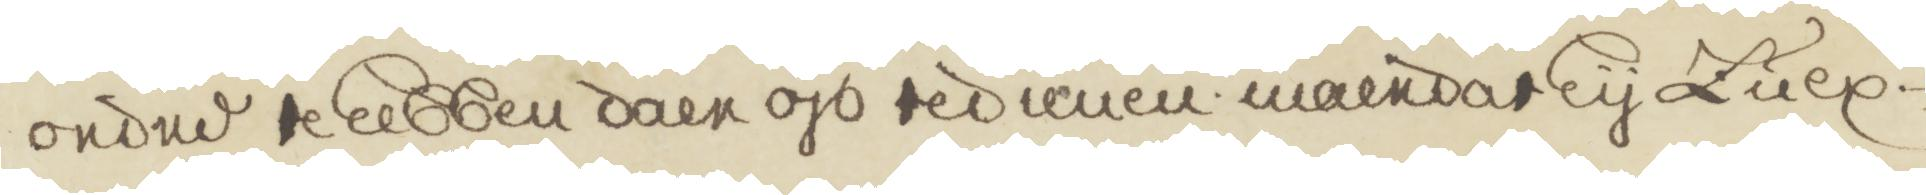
ordre te hebben daer op te dienen maer dat hij zulx.
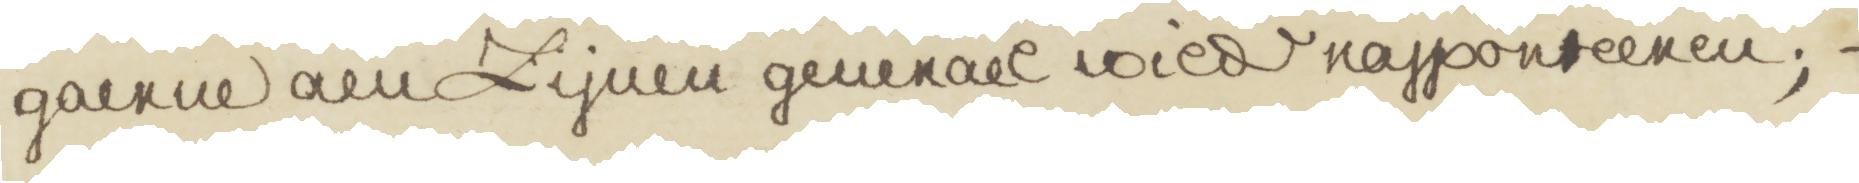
gaerne aen zijnen generael wilde rapporteeren;
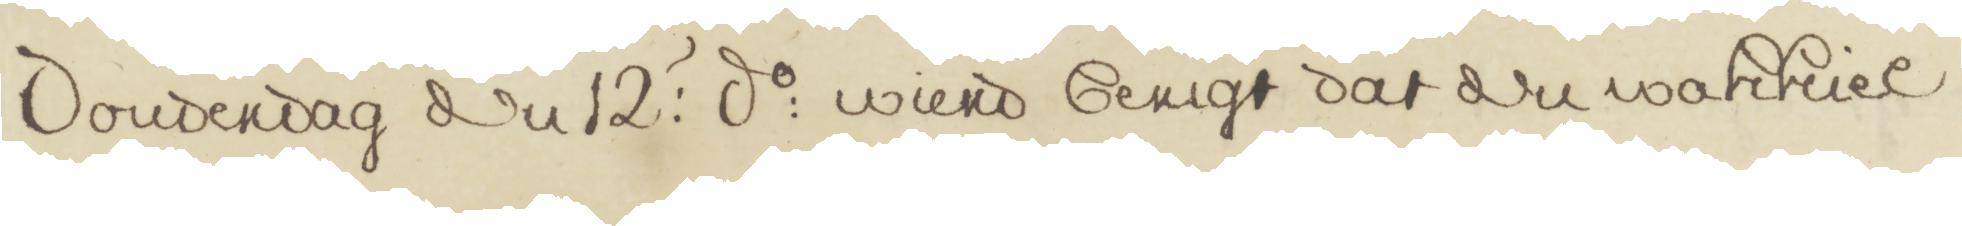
Donderdag den 12:' d:o wierd berigt dat den wakkiel
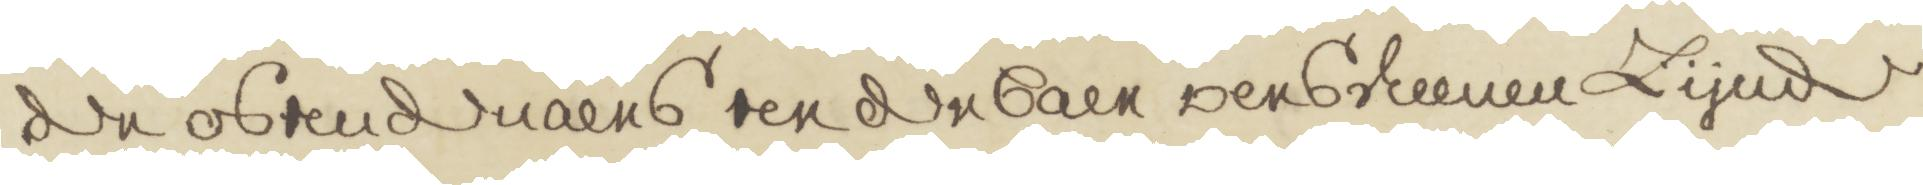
der ostendenaers ter der baer verscheenen zijnde
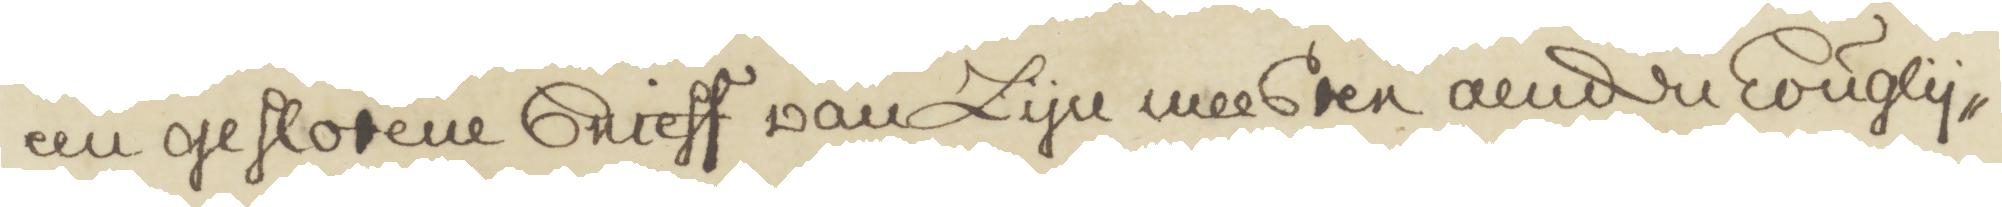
een geslotene brieff van zijn meester aen den houglij„
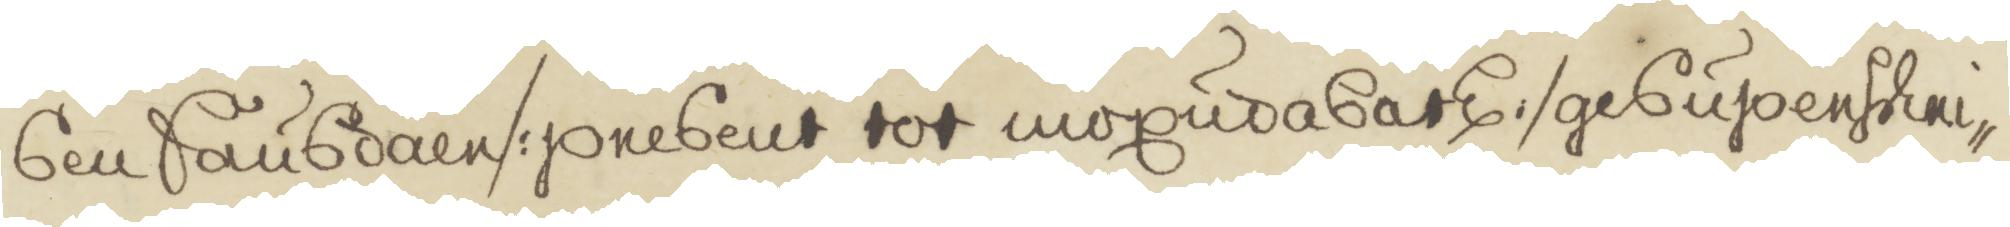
sen fausdaer /: present tot moxudabath :/ gesuperschri„
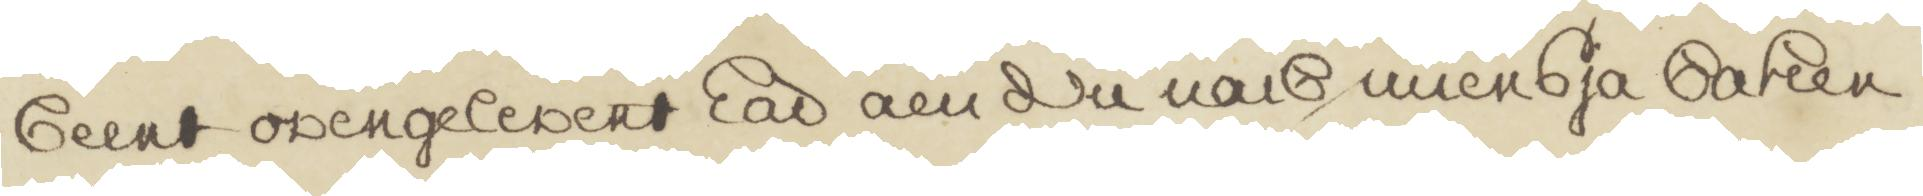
beert overgelevert had aen den naib miersja baker
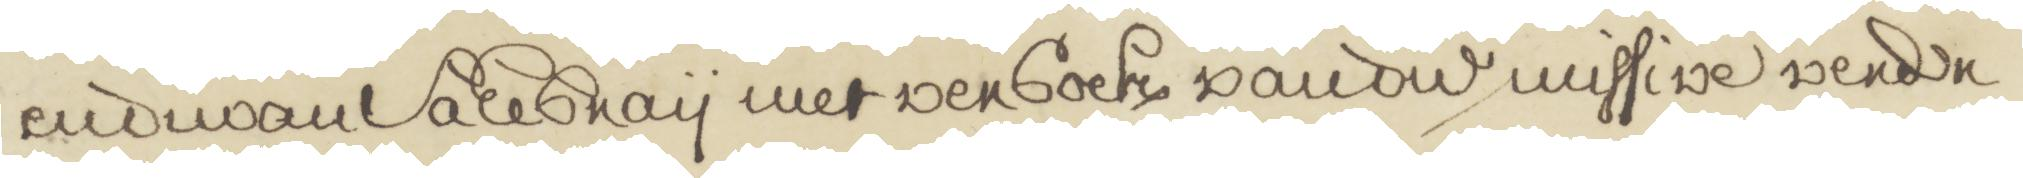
endiwan Sahebraij met versoek van die missive verder
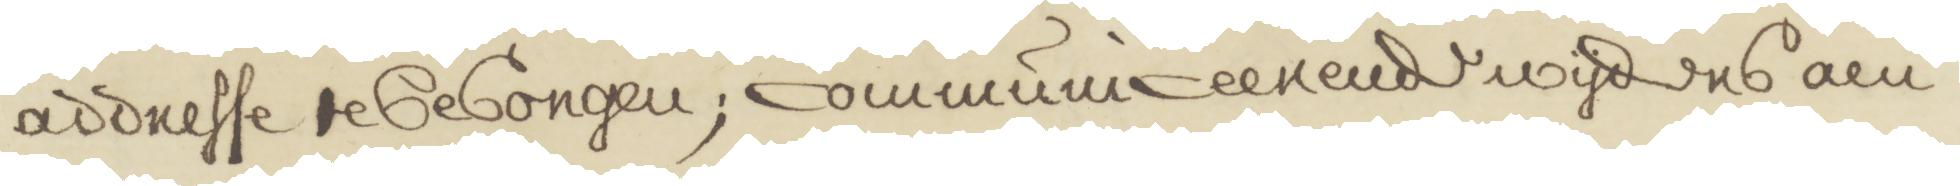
addresse te besorgen; communiceerende wijders aen
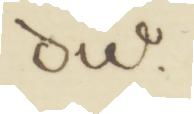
die.
